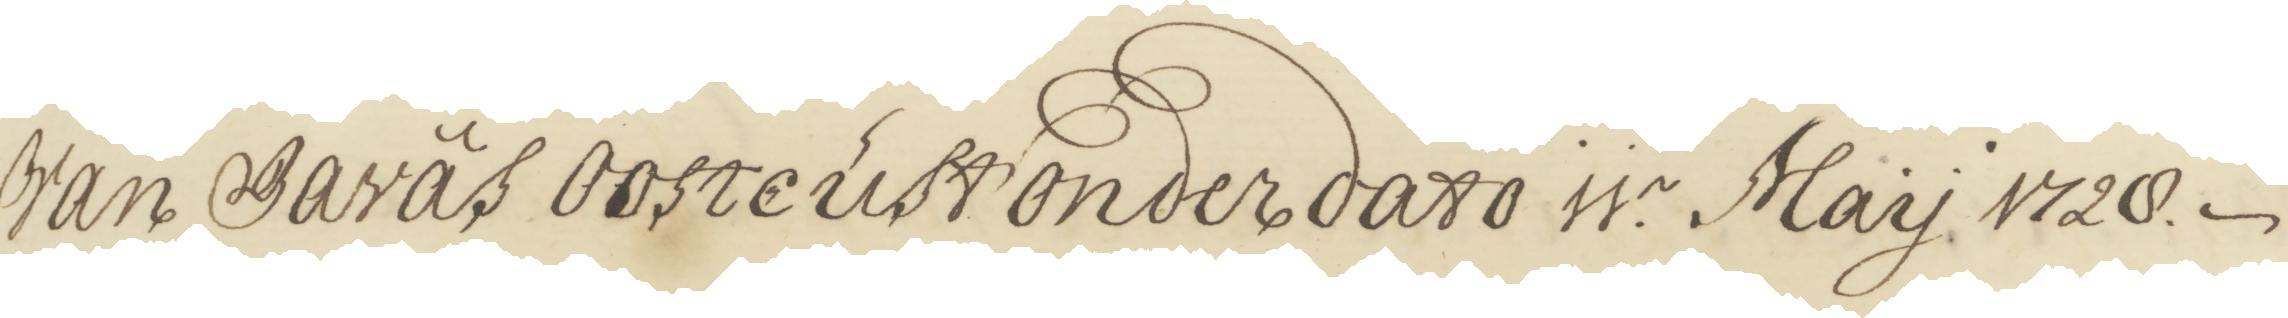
Van Javâs Oost cust onder dato 11:' Maij 1728. —
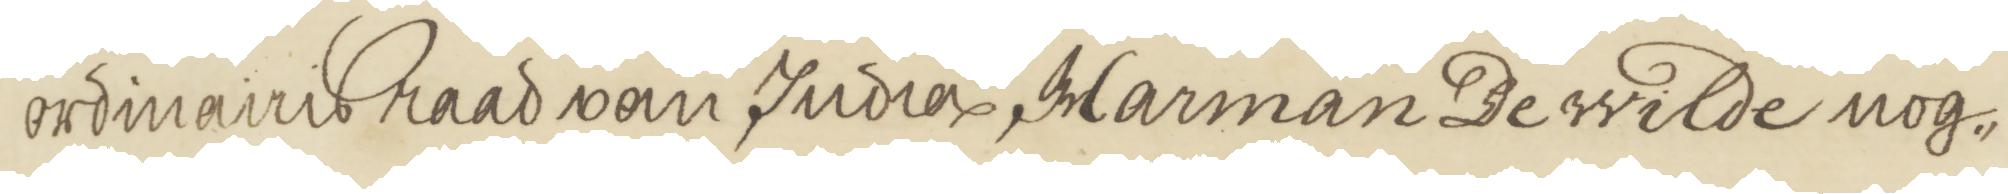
ordinairis raad van Jndia Harman De wilde nog„
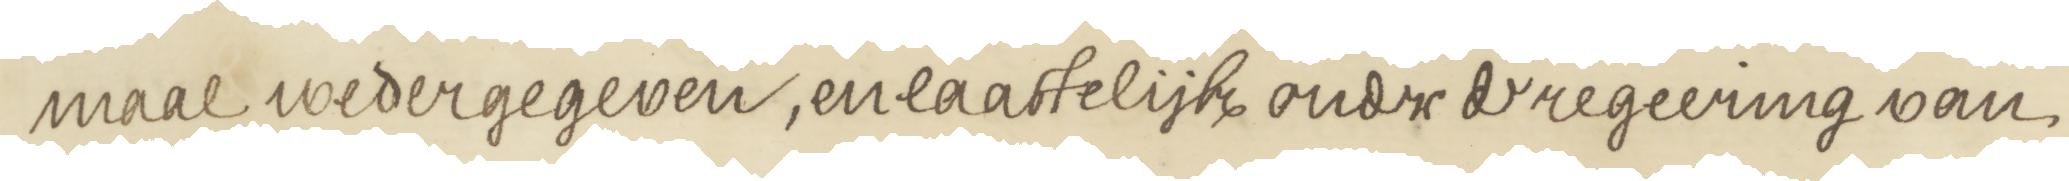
maal wedergegeven, en laastelijk onder de regeering van
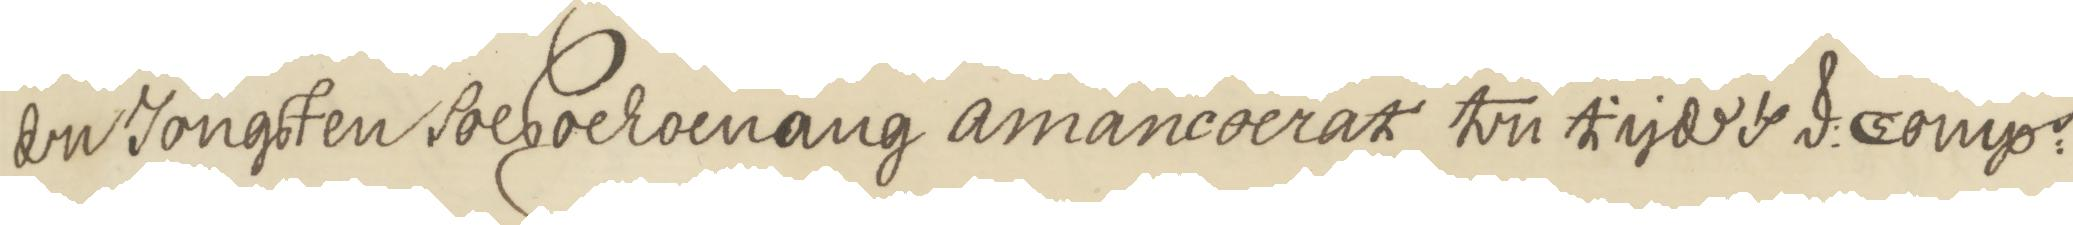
den Jongsten soesoehoenang amancoerat ten tijde ’s E: comp:s
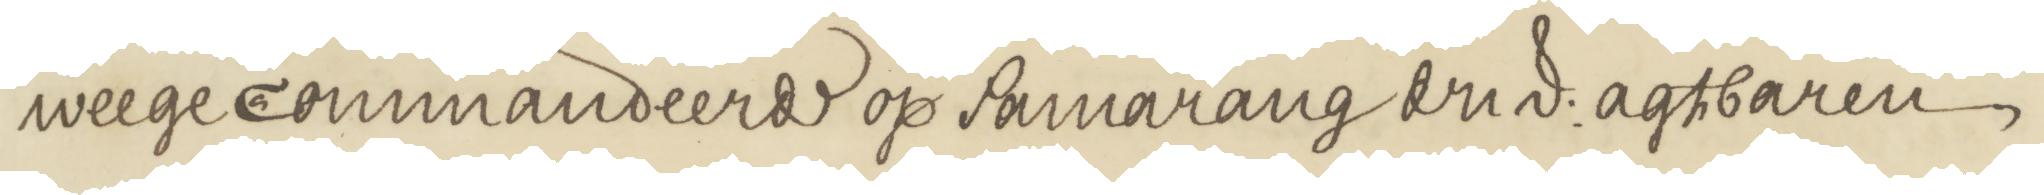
weege commandeerde op samarang den E: agtbaren
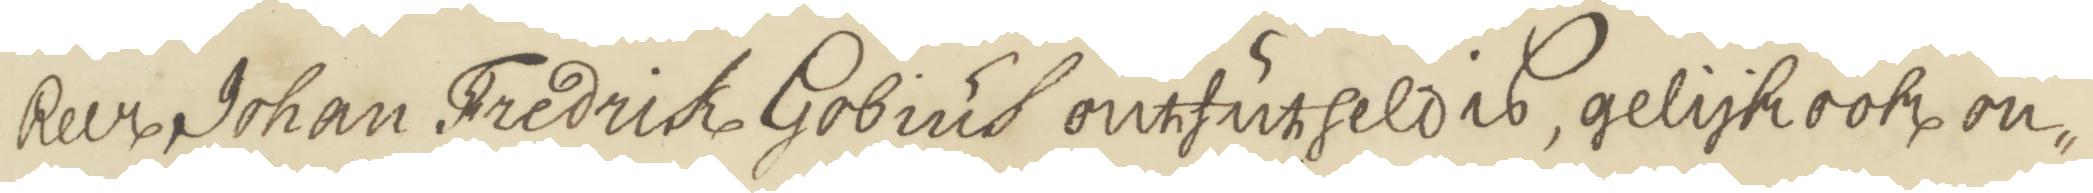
heer Johan Fredrik Gobius ontfutseld is, gelijk ook on„
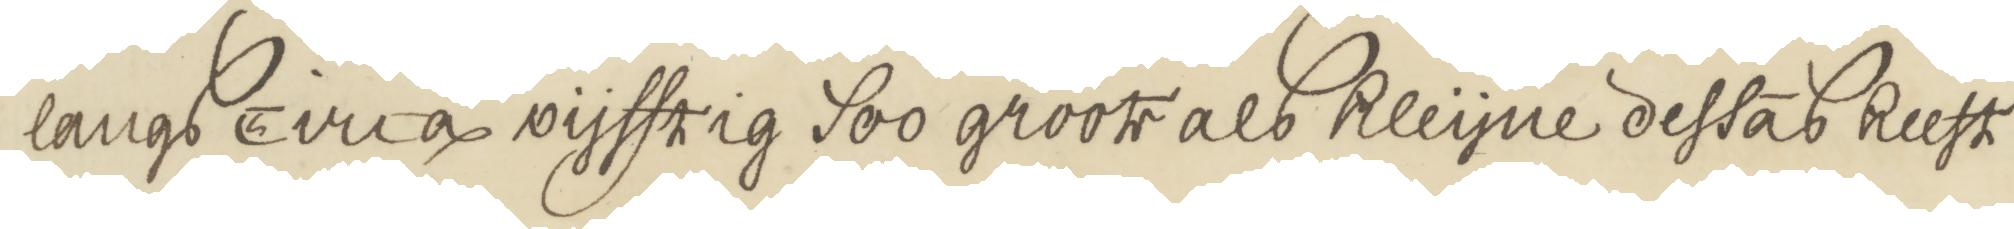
langs circa vijfftig soo groote als kleijne dessas heeft
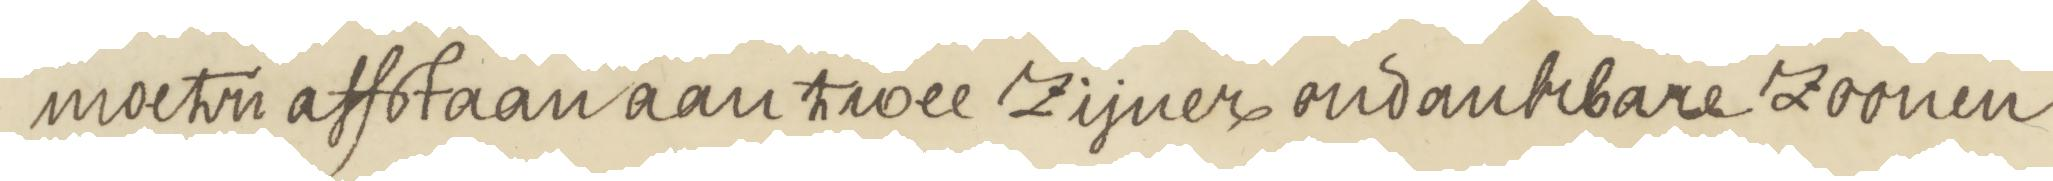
moeten affstaan aan twee zijner ondankbare zoonen
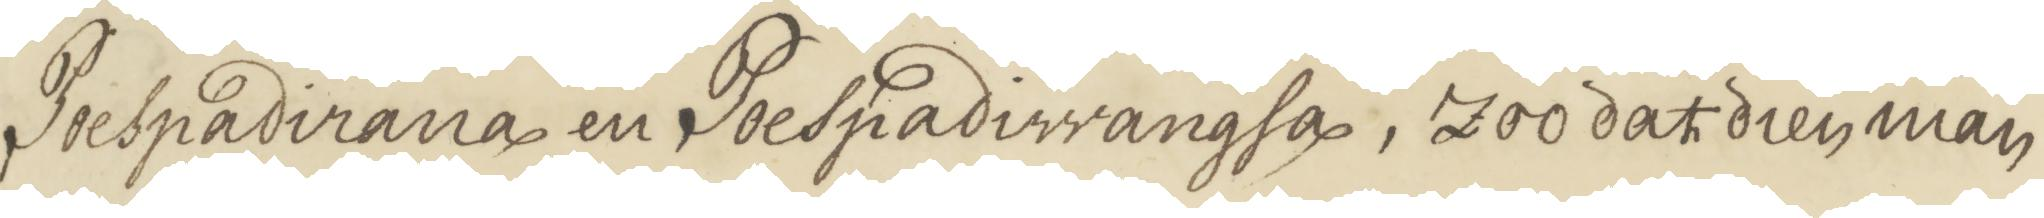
Poespadirana en Poespadiwangsa, zoo dat dien man
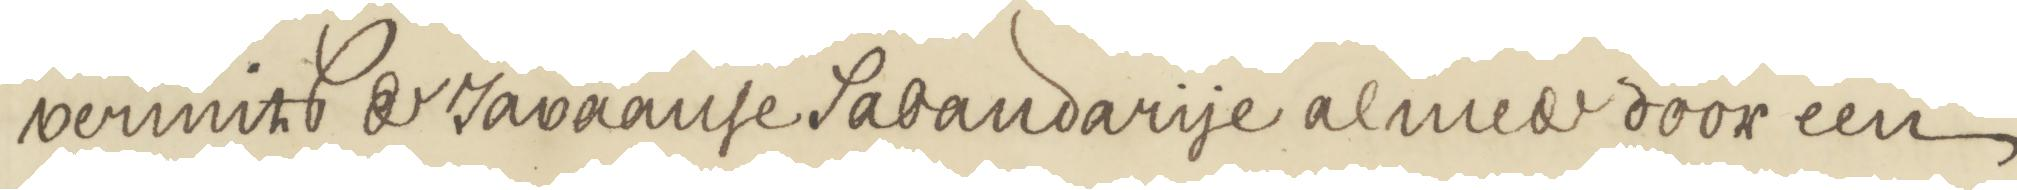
vermits de Javaanse sabandarije almede door een
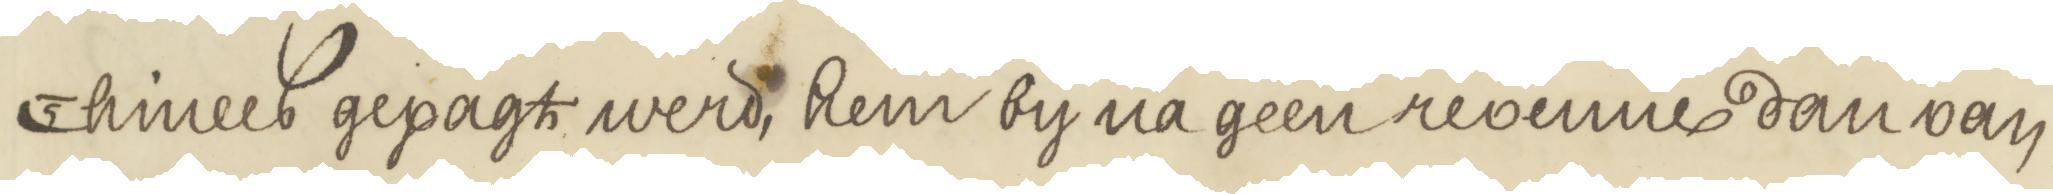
chinees gepagt werd, hem bij na geen revenue dan van
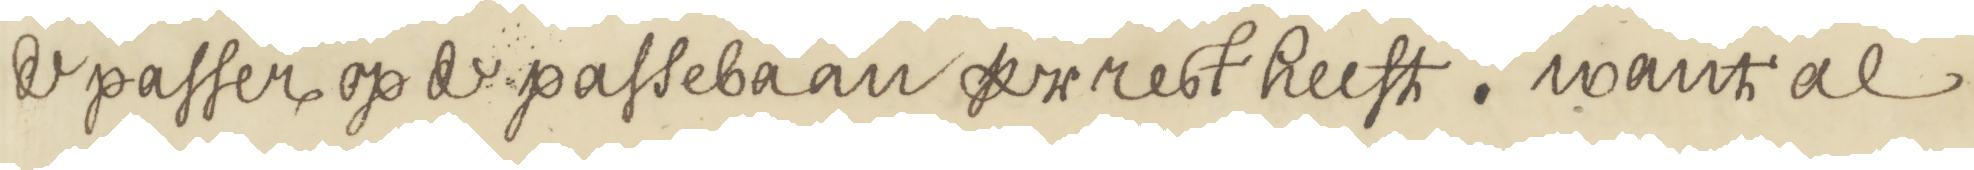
de passer op de passebaan per rest heeft, want al
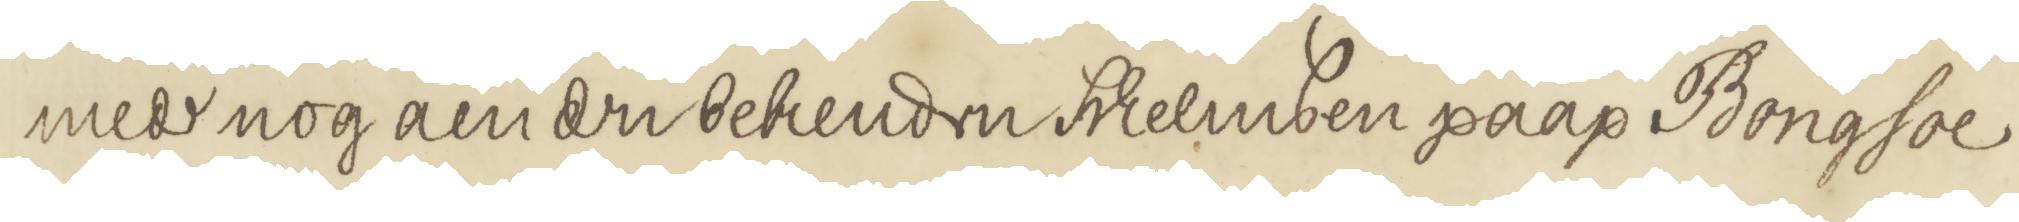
mede nog aen den bekenden schelmsen paap Bongsoe
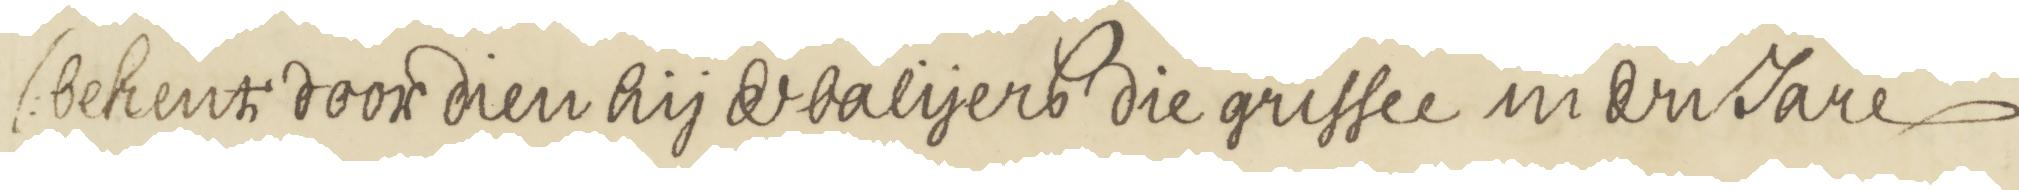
/:bekent door dien hij de balijers die grissee in den Jare
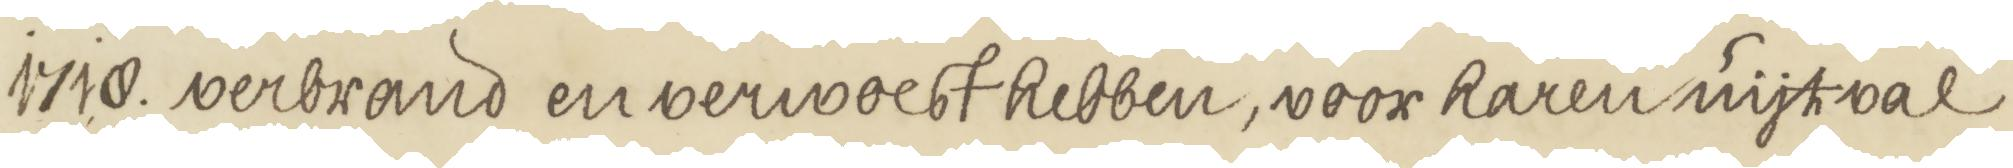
1718. verbrand en verwoest hebben, voor haren uijt val
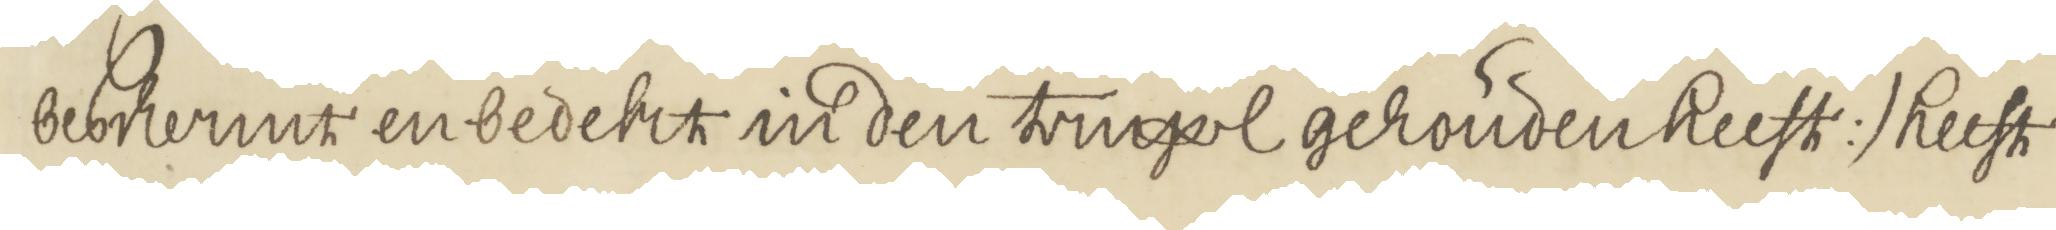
beschermt en bedekt in den tempel gehouden heeft:/ heeft
